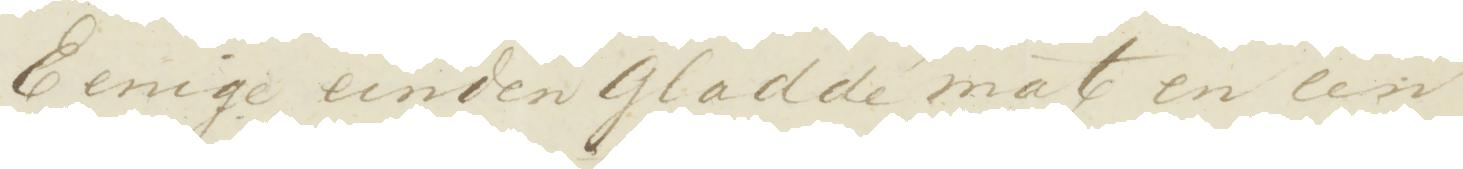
Eenige einden Gladde mat en een
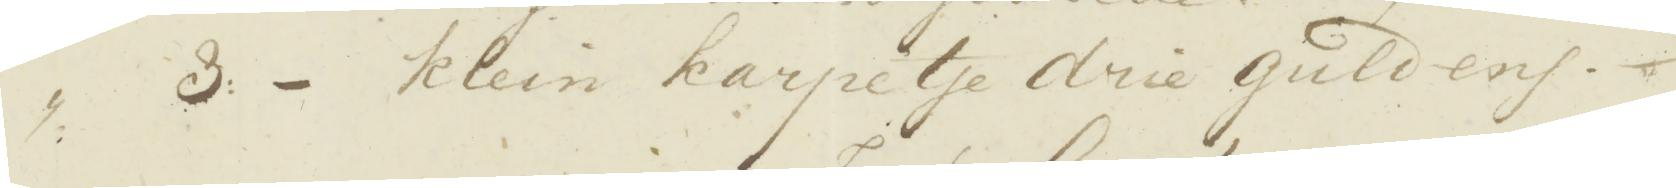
„ 3: — klein karpetje drie guldens. —
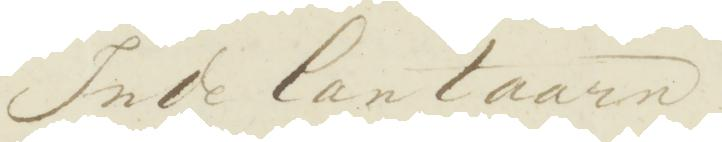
Inde lantaarn
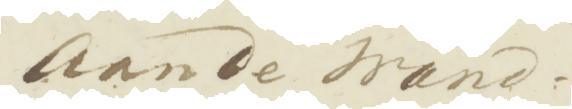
Aan de wand:
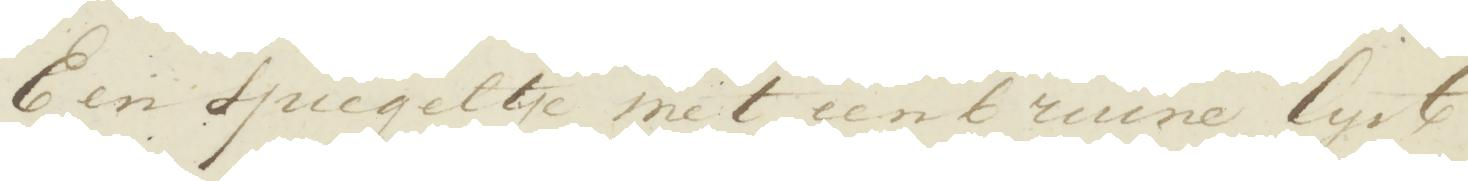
Een spiegeltje met een bruine lyst
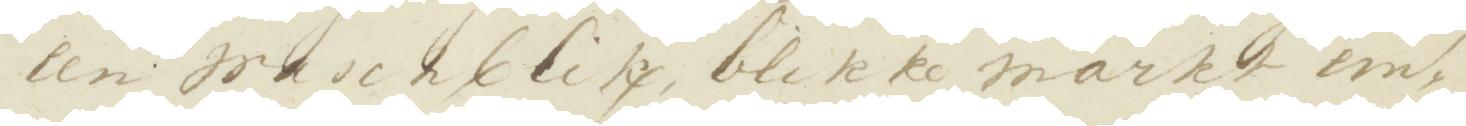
een waschblik, blikke markt em„
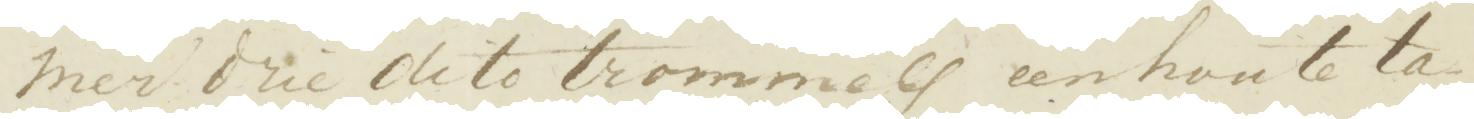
mer drie dito trommels een houte ta„
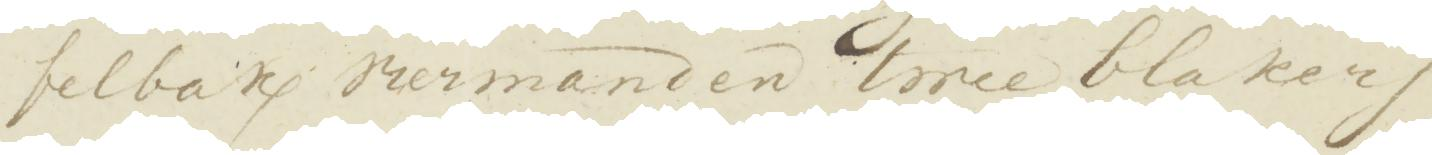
felbak vier manden twee blakers
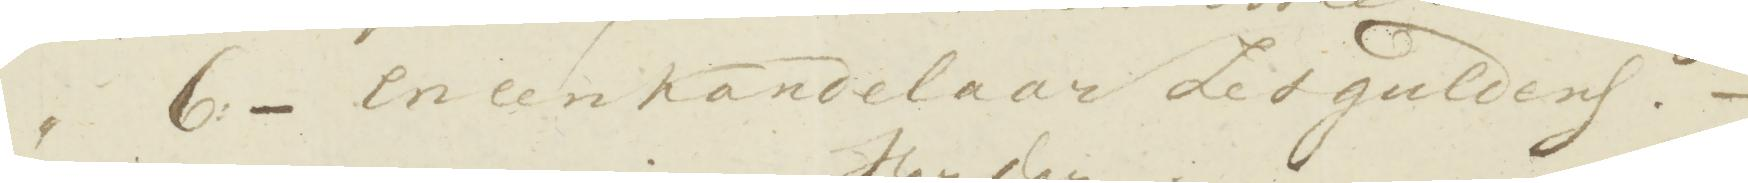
„ 6: — En een kandelaar Zes guldens. —
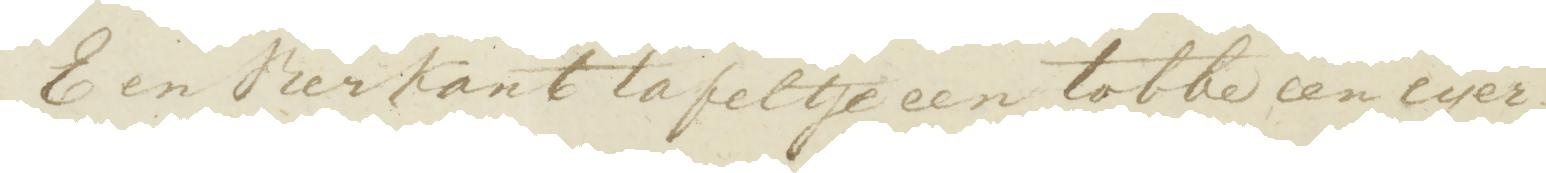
Een Vierkant tafeltje een tobbe een eijer,
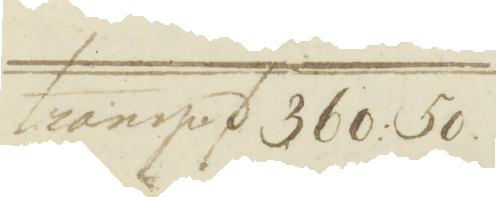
transp. ƒ 360: 50
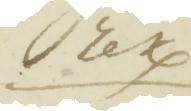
rek
